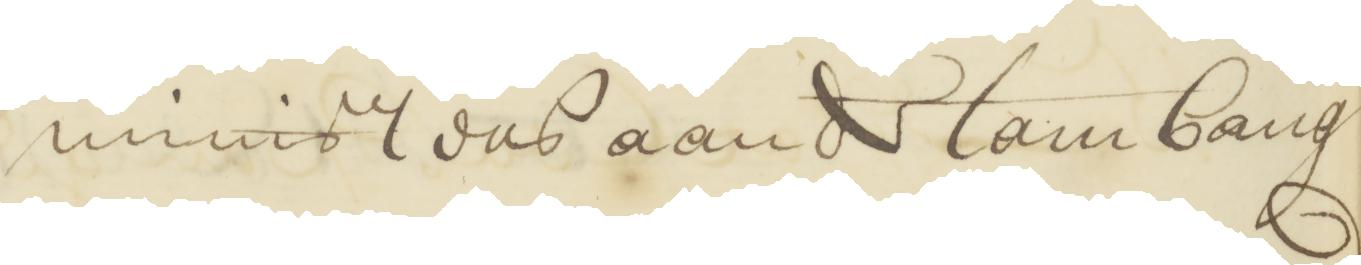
ministers aan de tambang
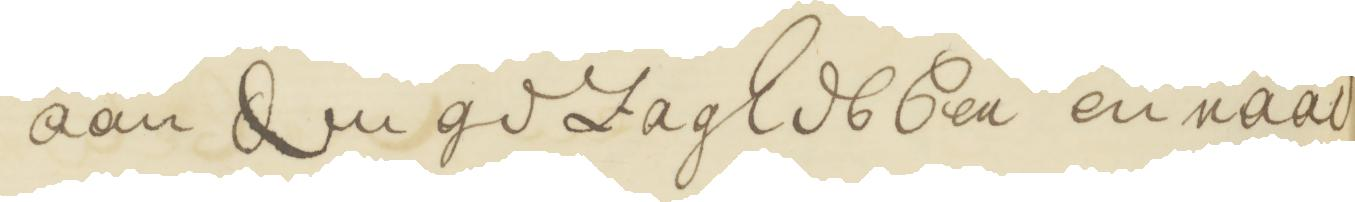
aan den gezaghebber en raad
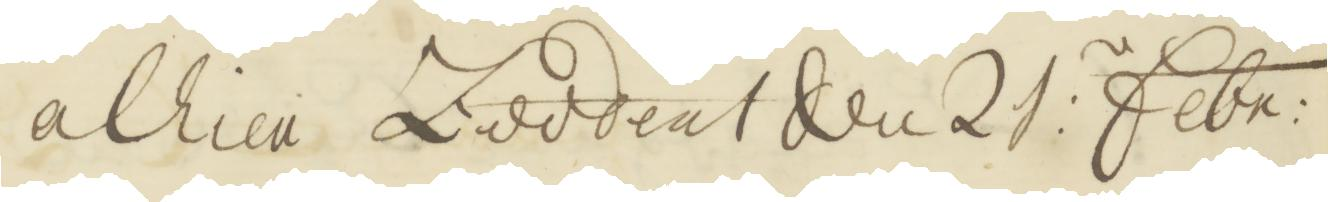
alhier Zeedert den 21.:e febr:
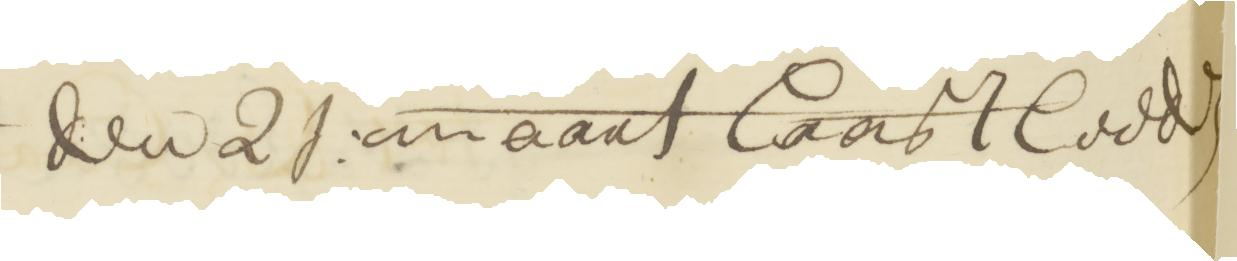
den 21:' maart laast leeden
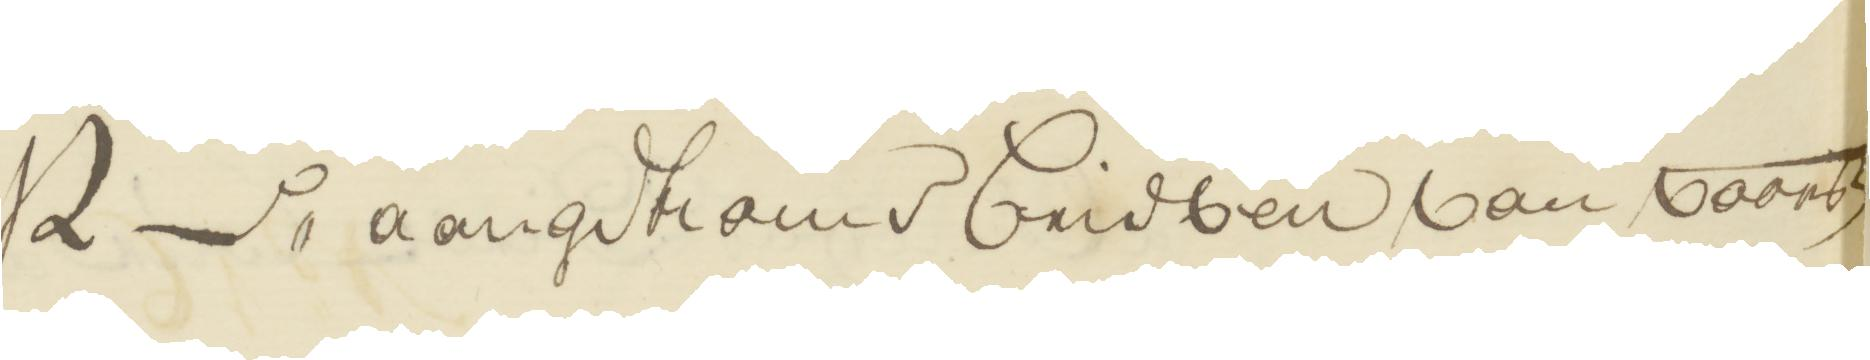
12 _„o aangekome brieven van voors
